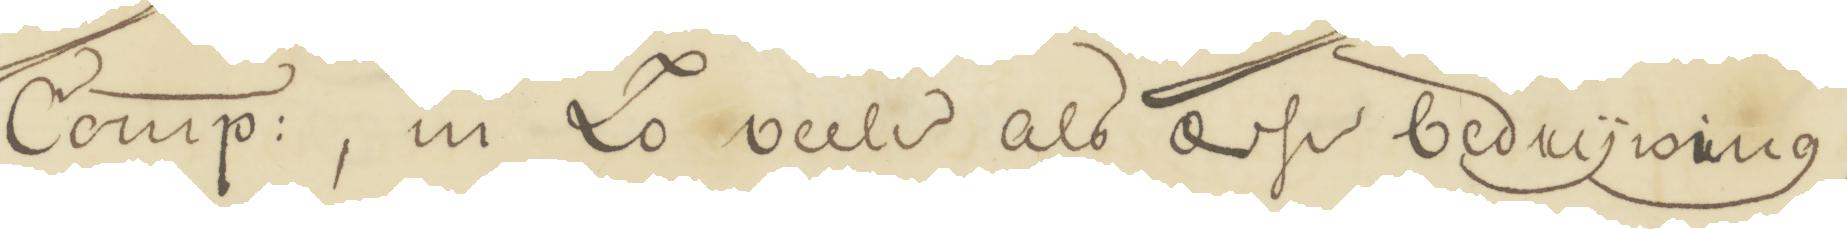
Comp:, in Zo veele als dese bedrijving
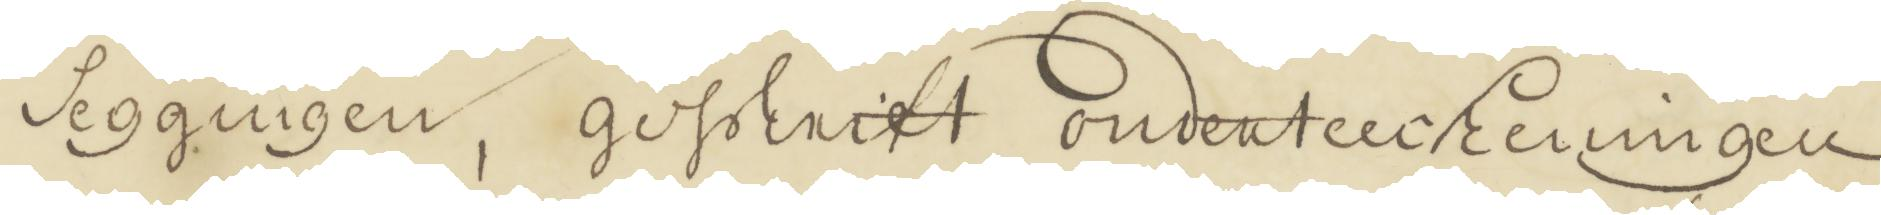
Seggingen, geschrift onderteeckeningen
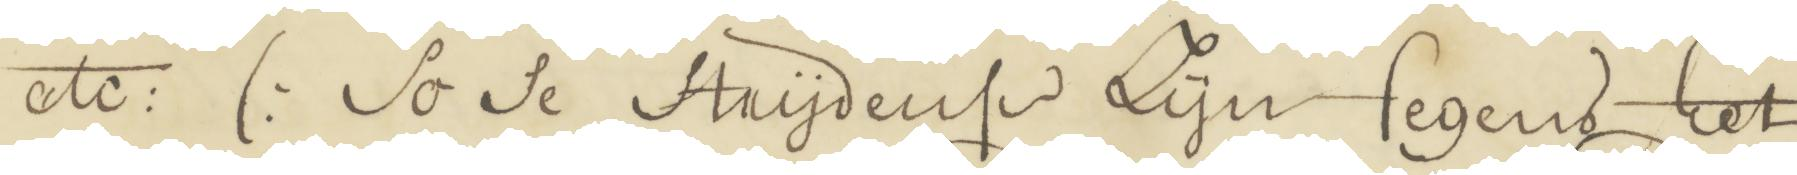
etc: (: So Se Strijdense Zijn tegens het
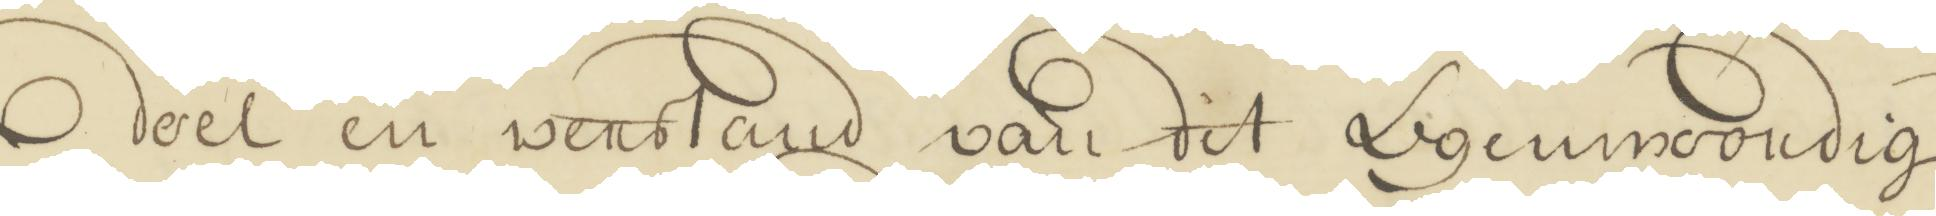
doel en verstand van dit tegenwoordig
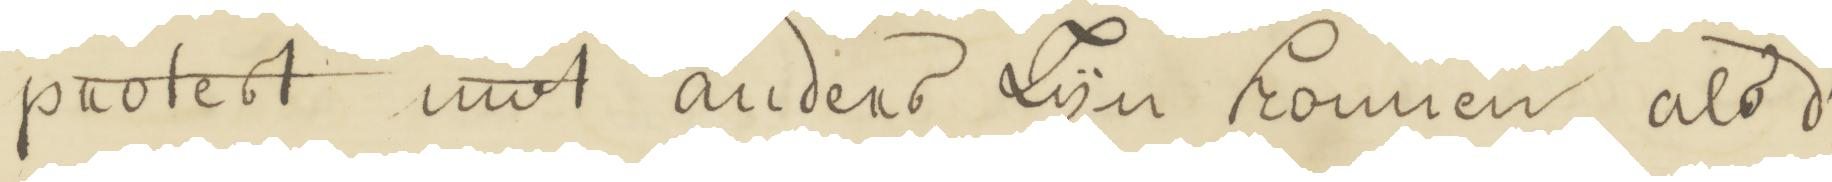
protest niet anders Zijn konnen als d'
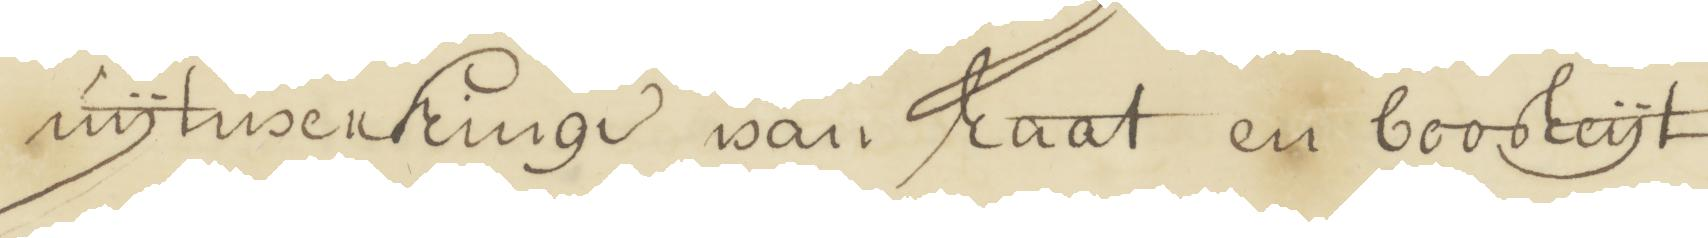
uijtwerkinge van haat en boosheijt
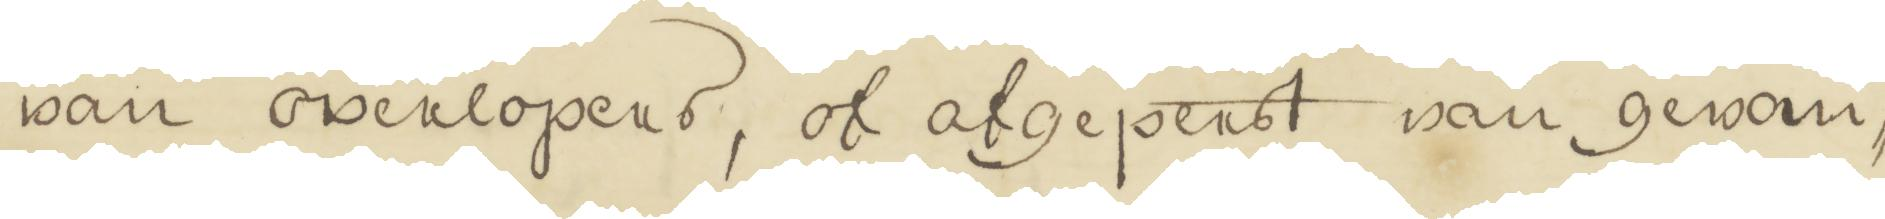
van overlopers, of afgeperst van gevan„
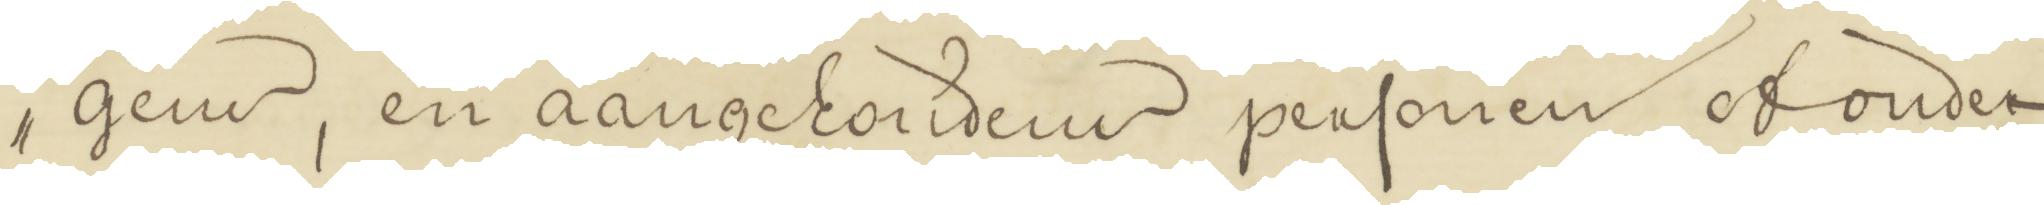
„gene, en aangehoudene personen of onder
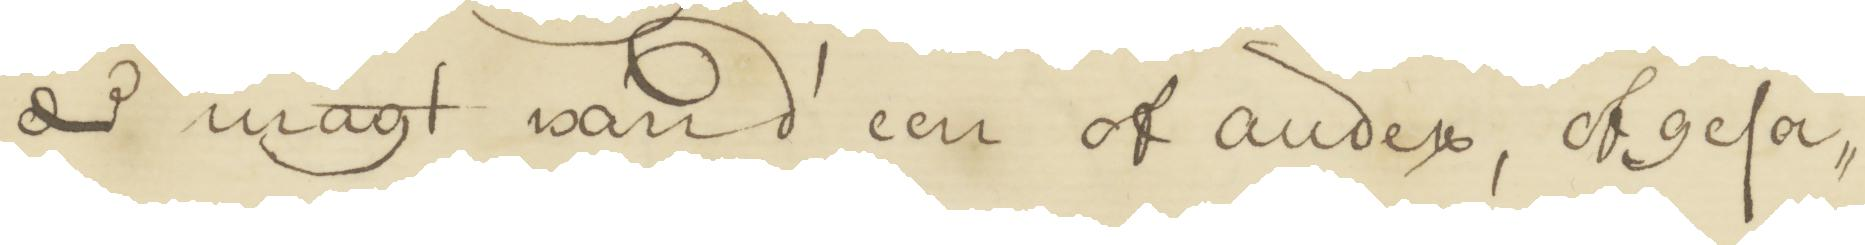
de magt van d’ een of ander, of gesa„
